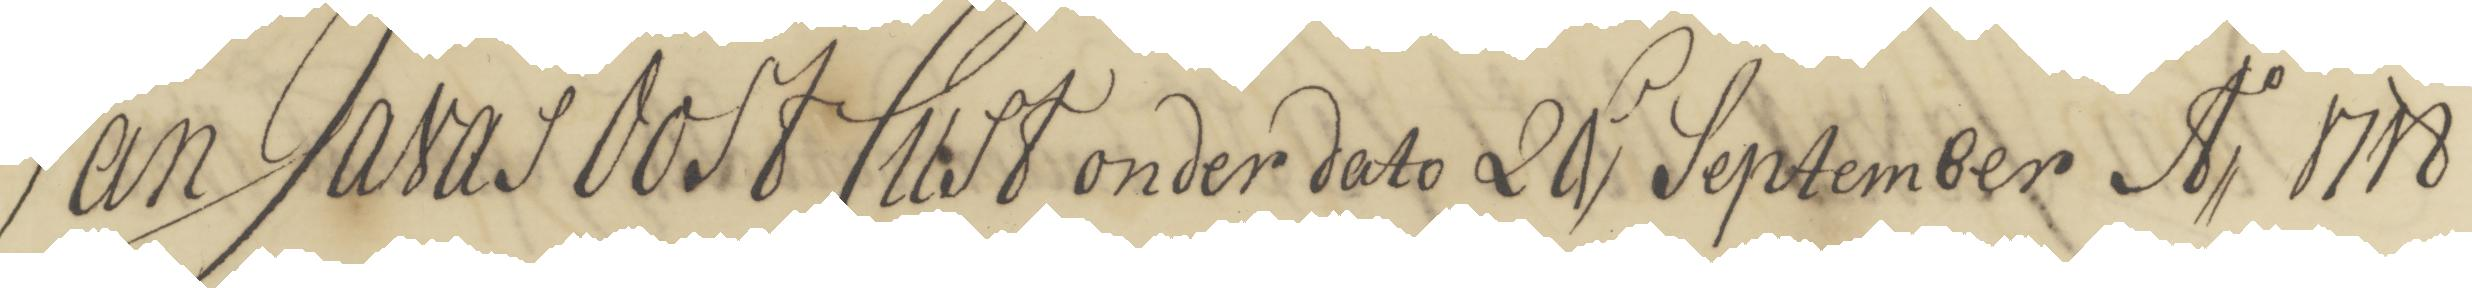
Van Javas Oost Cust onder dato 24„en September A„o 1718
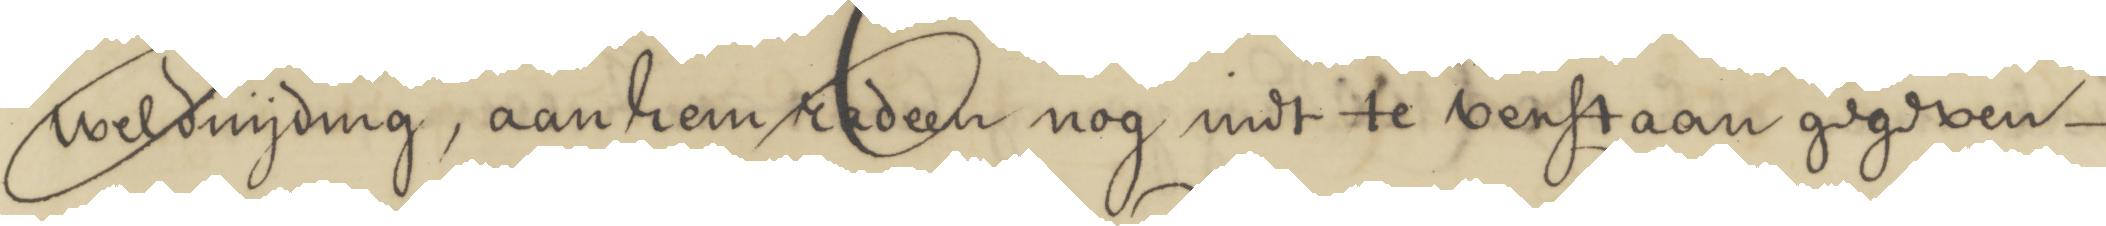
welduijding, aan hem radeen nog niet te verstaan gegeven-
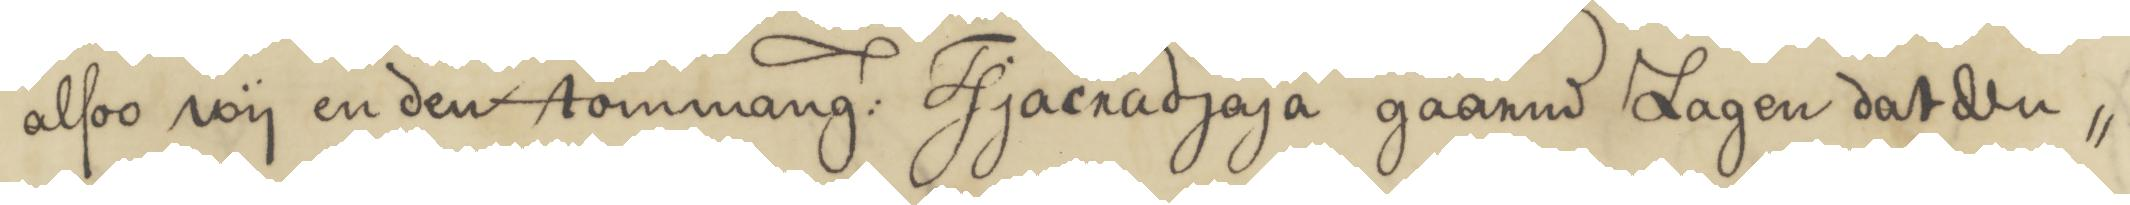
alsoo wij en den tommang:' Tsjacradjaja gaarne Zagen dat den„
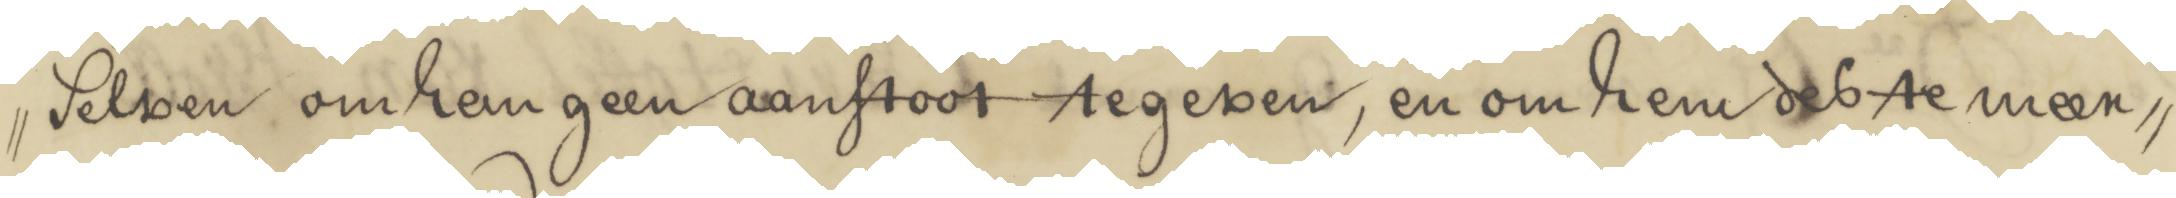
„selven om hem geen aanstoot tegeven, en om hem des te meer„
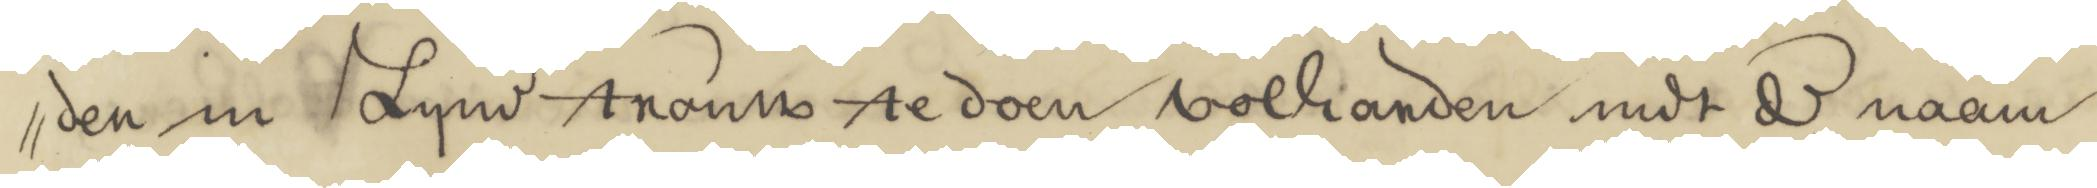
„der in Zijne trouw te doen volharden met de naam
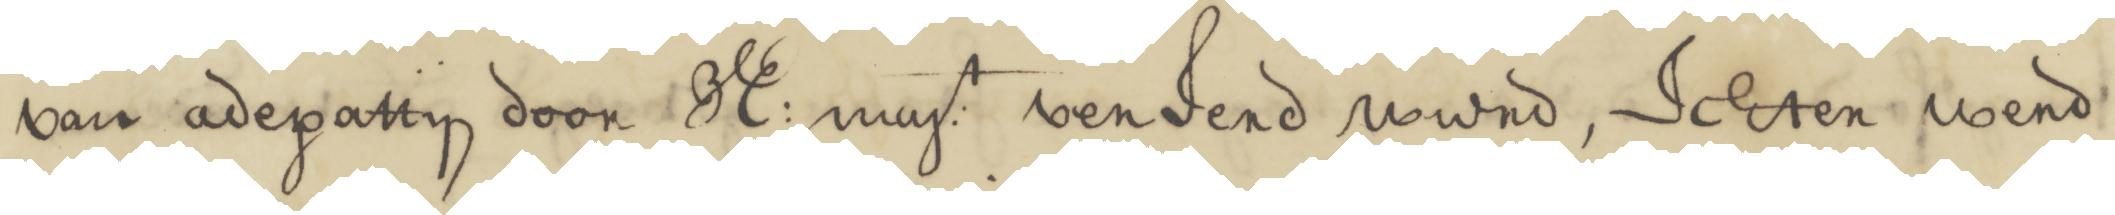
van adepattij door VE: maj:t vereerd wierd, Echter werd
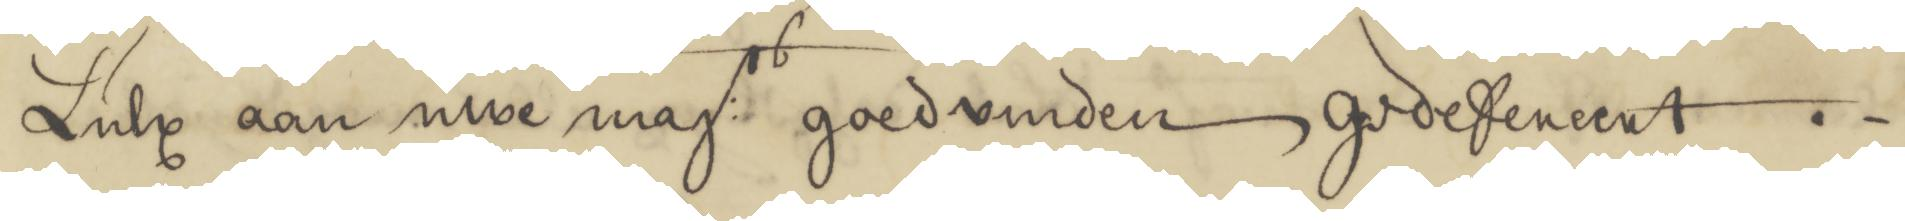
Zulx aan uwe maj:ts goedvinden gedefereert.-
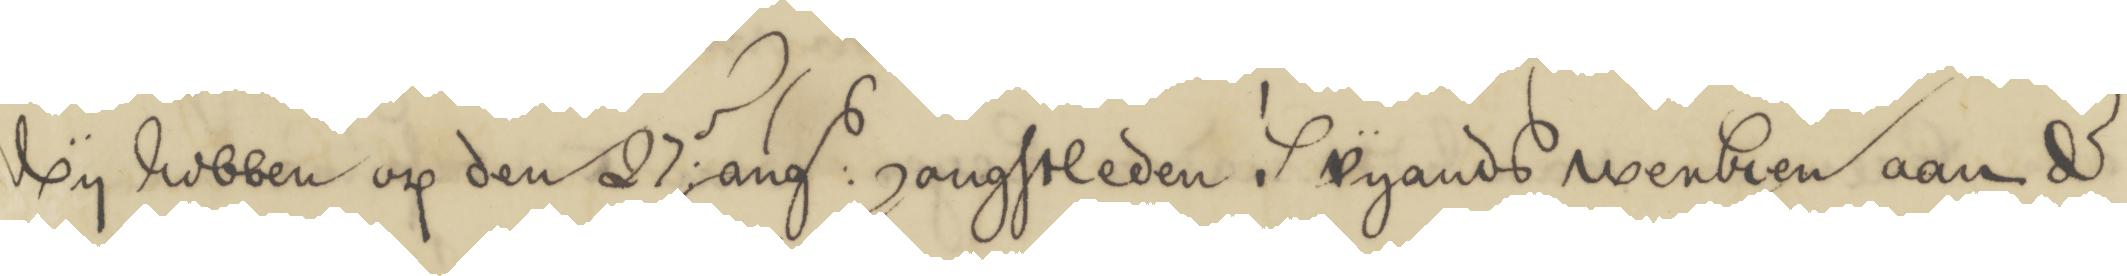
wij hebben op den 27:e aug:s Jongstleden 's vijands werken aan de
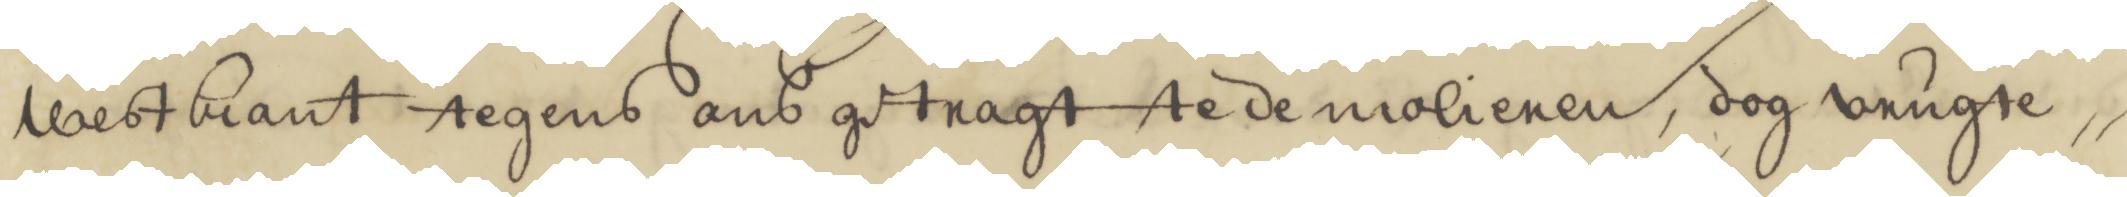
westkant tegens ons getragt te de molieren, dog vrugte„
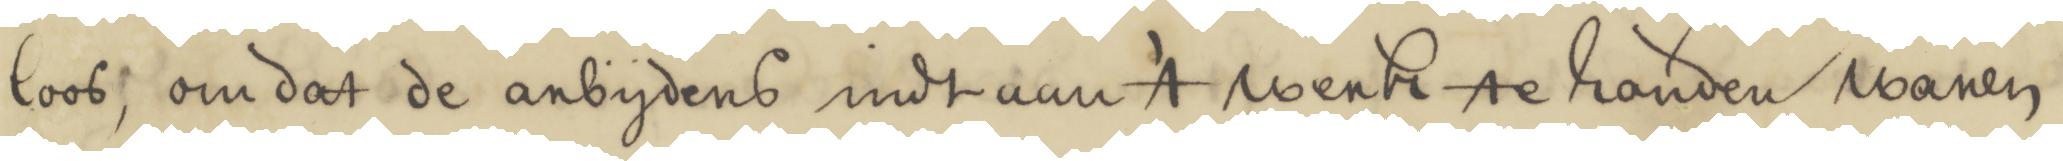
loos, om dat de arbijders niet aan ’t werk te houden waren
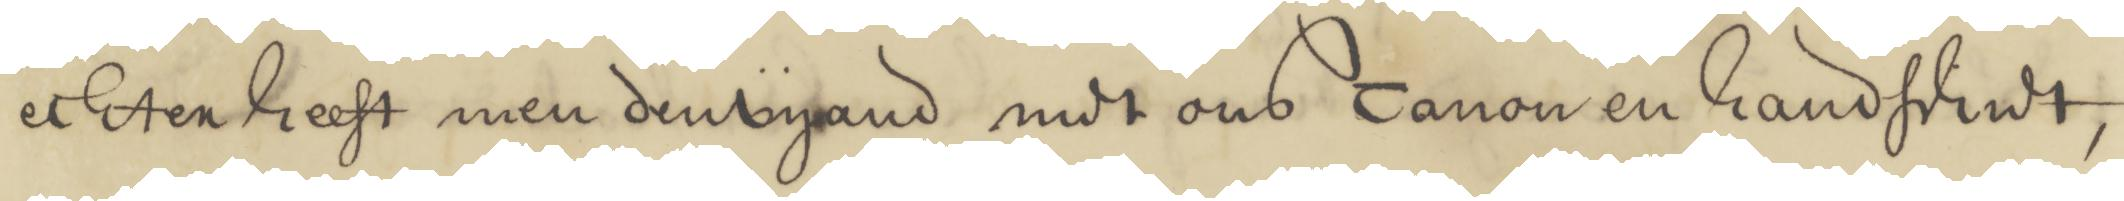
echter heeft men den vijand met ons canon en handschiet,
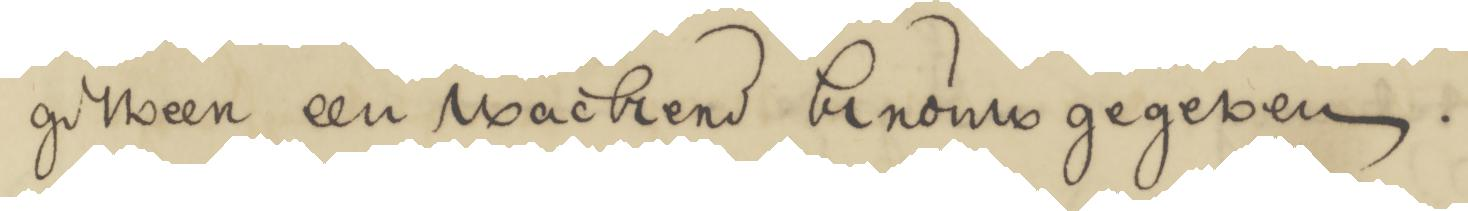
geweer een wackere krouw gegeven.
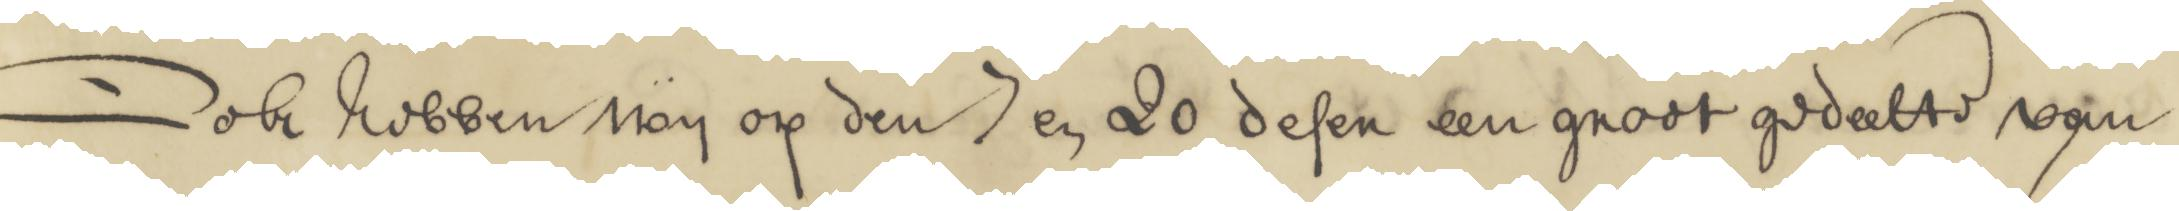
Ook hebben wij op den 7' en 20 deser een groot gedeelte van
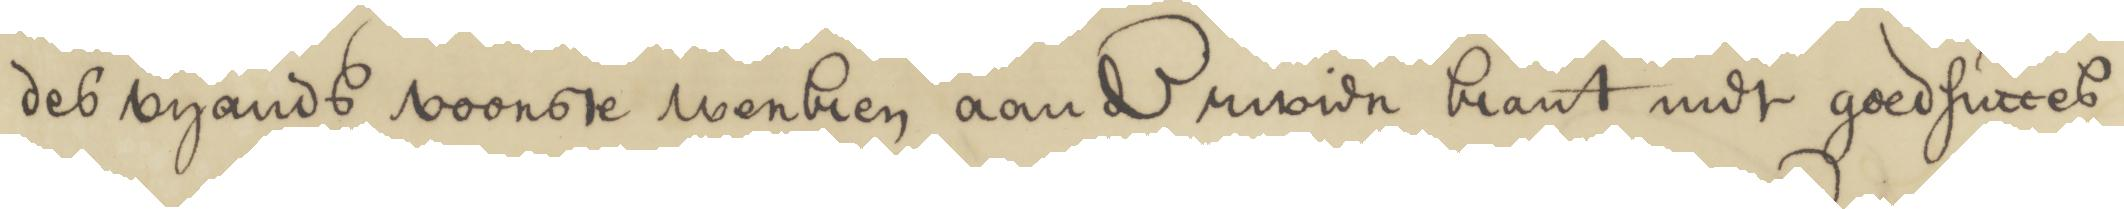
des vijands voorste werken aan de rivier kant met goed succes
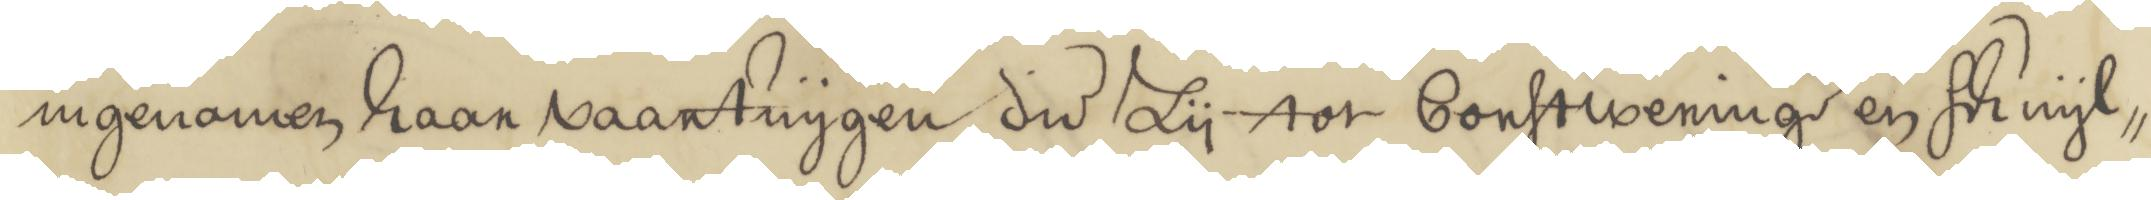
ingenomen haar vaartuijgen die Zij tot borstweringe en Schuijl„
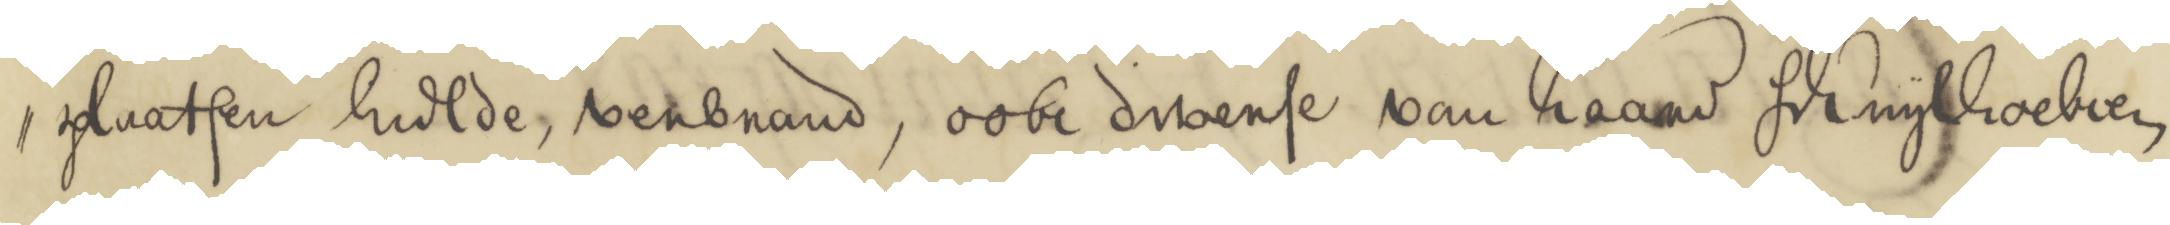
„plaatsen hielde, verbrand, ook diverse van haare Schuijlhoeken
